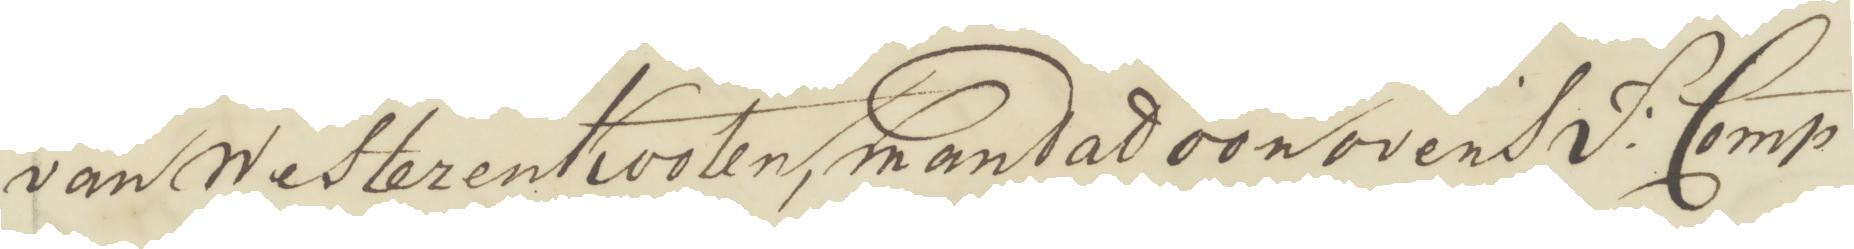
van westerenKooten, mandadoor over 's E: Comp:s
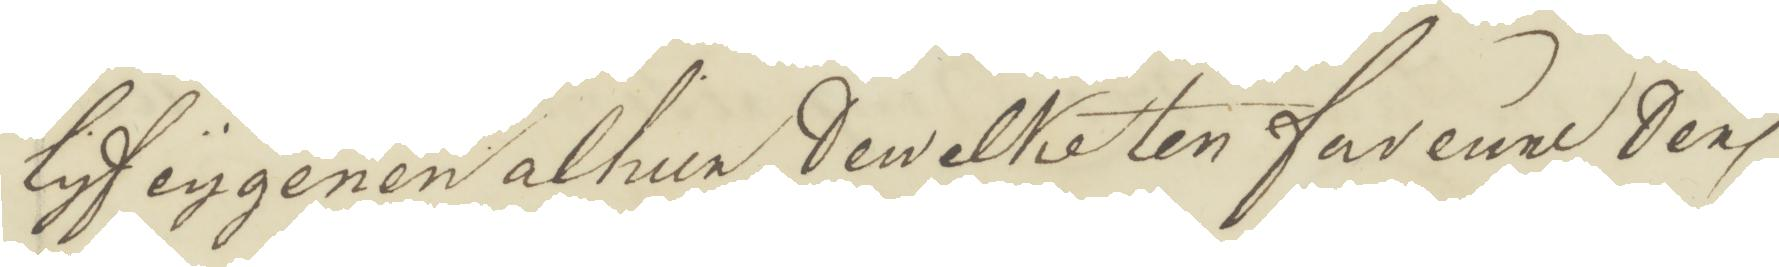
lijfeijgenen alhier, dewelke ten faveure der
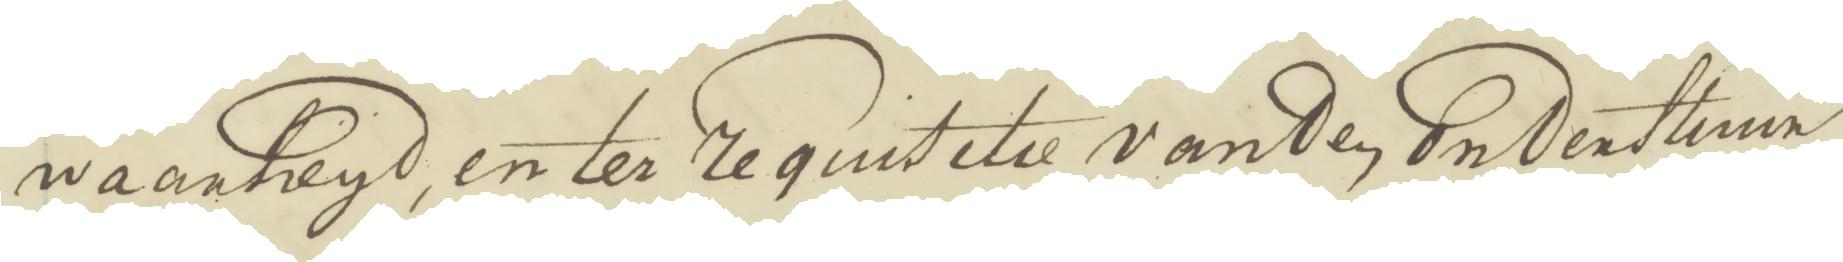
waarheijd, en ter requisitie van den onderstuur
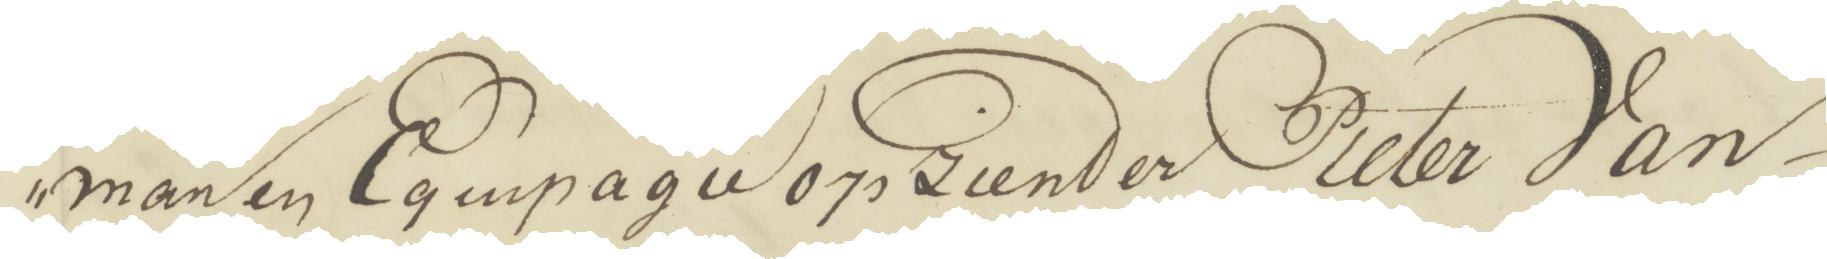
man en Equipagie opziender Pieter Van
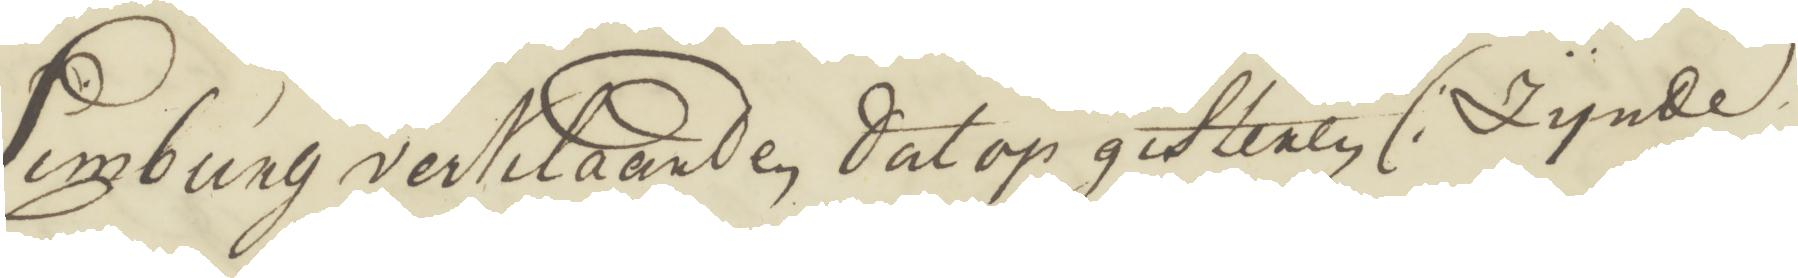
Limburg verklaarden dat op gisteren (:zijnde
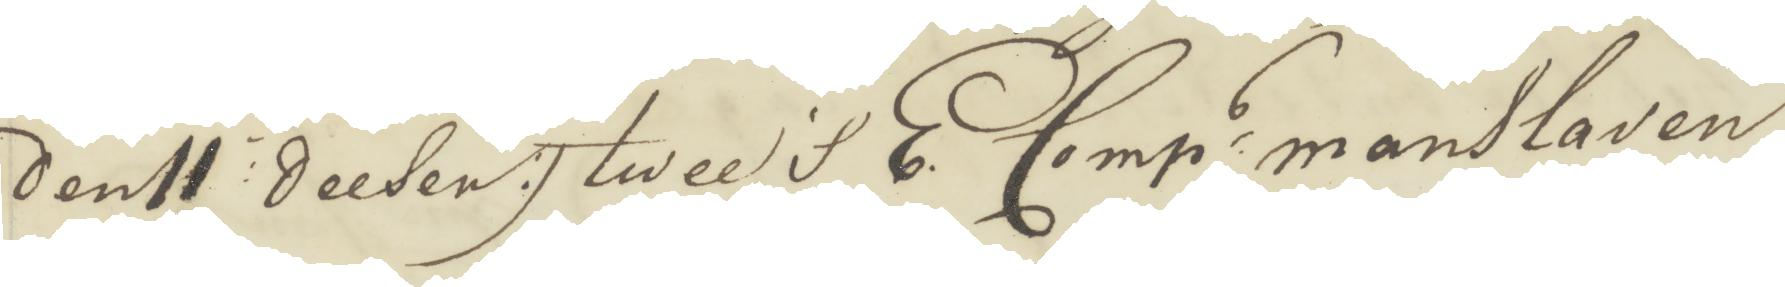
den 11:' deeser:) twee ’s E. Comp=s manslaven
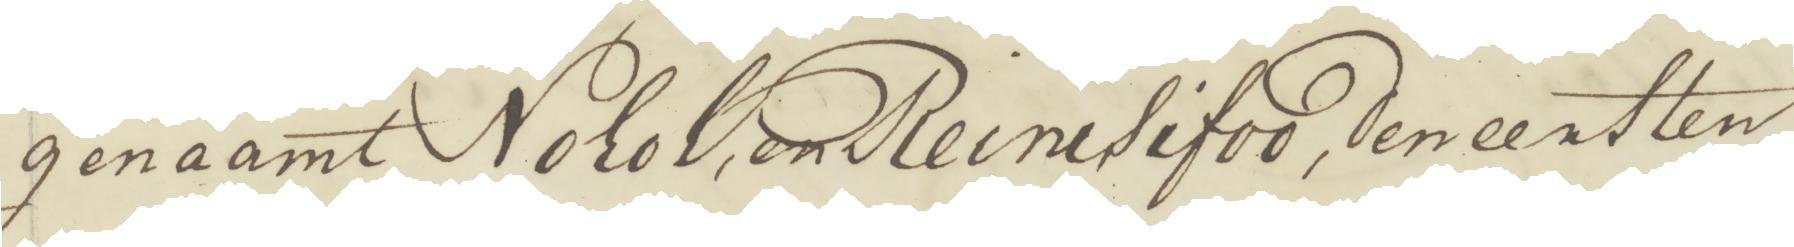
genaamt Nohol, en Reinisifoo, den eersten
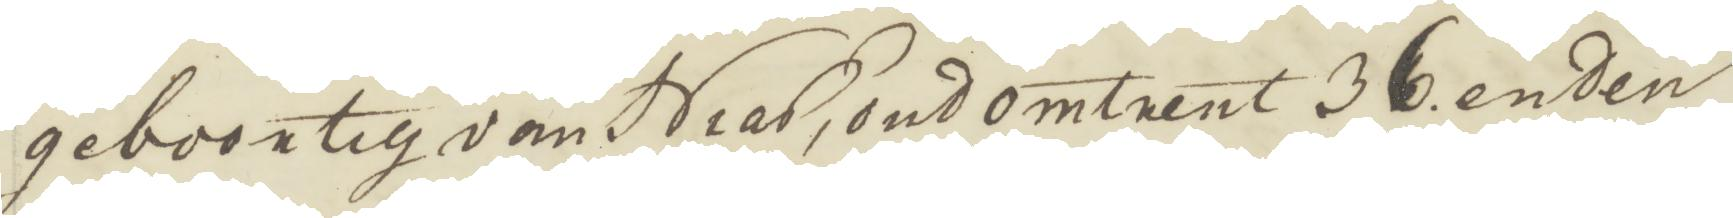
geboortig van Nias, oud omtrent 36. en den
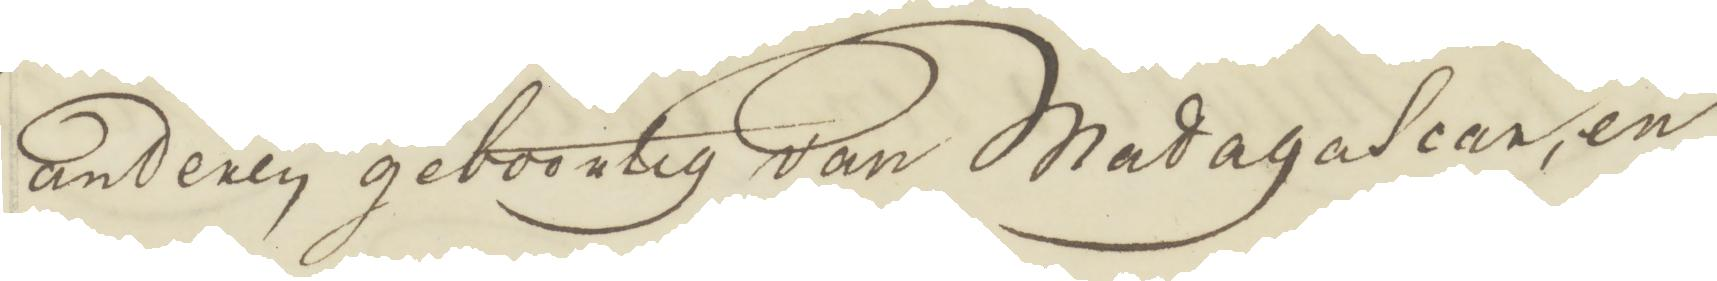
anderen geboortig van Madagascar, en
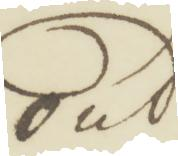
oud
